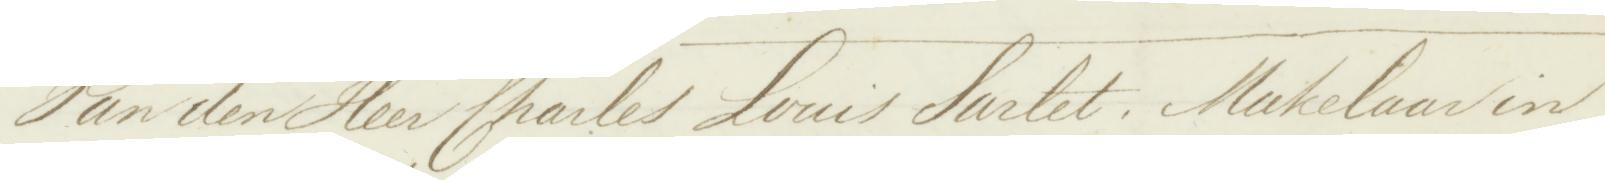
3º. Van den Heer Charles Louis Sarlet, Makelaar in
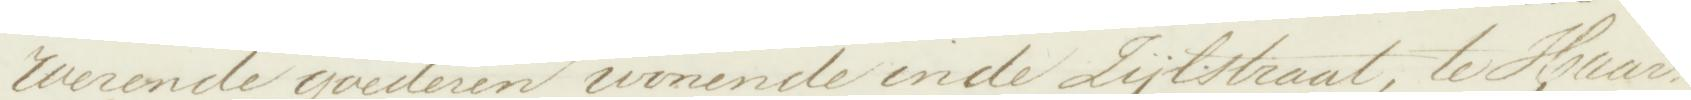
roerende goederen wonende in de Zijlstraat te Haar„
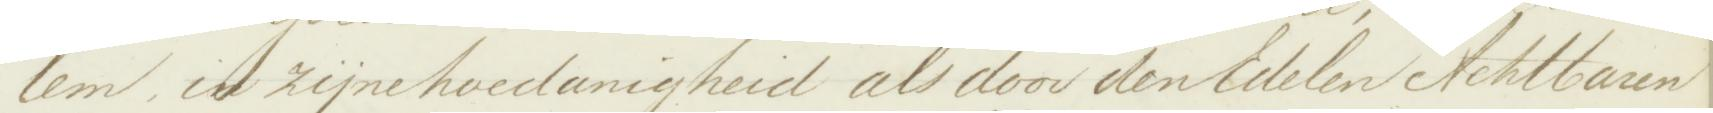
lem, in zijne hoedanigheid als door den Edelen Achtbaren
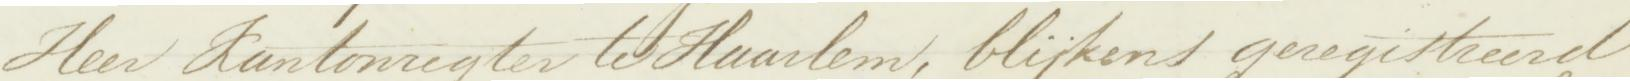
Heer Kantonregter te Haarlem, blijkens geregistreerd
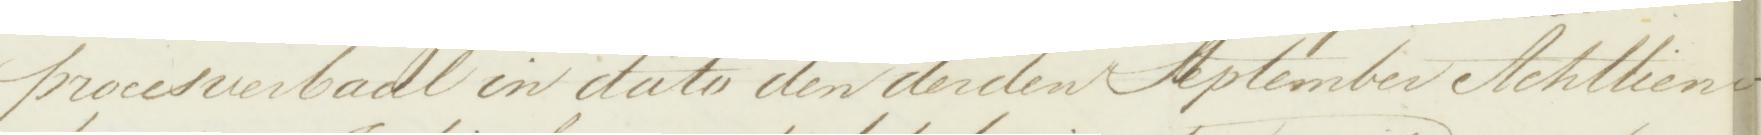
procesverbaal in dato den derden September Achttien
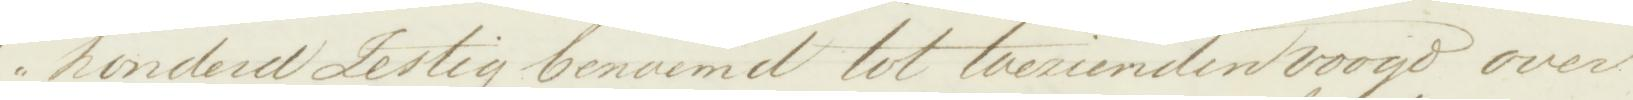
„honderd Zestig benoemd tot toezienden voogd over
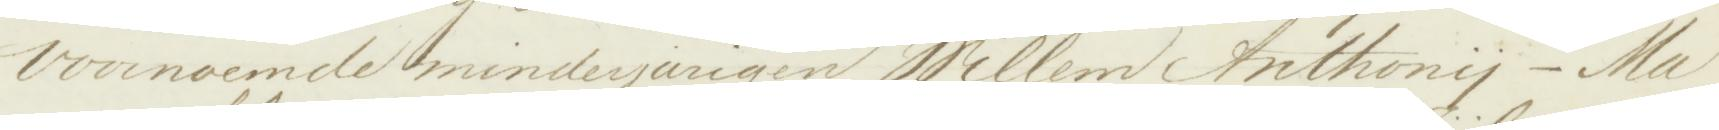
voornoemde minderjarigen Willem Anthonij - Ma
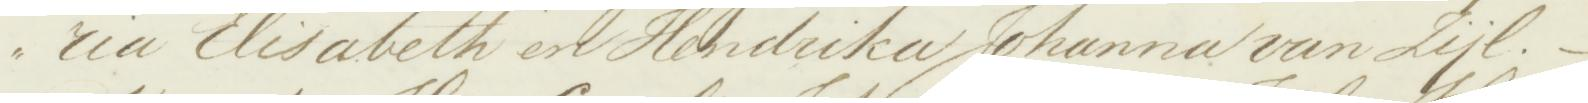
„ria Elisabeth en Hendrika Johanna van Zijl.
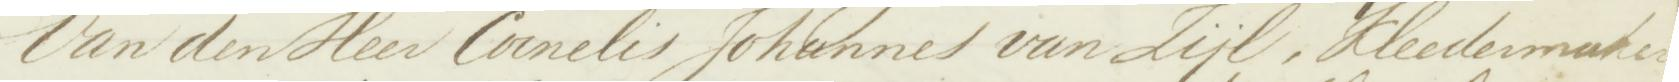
4:º van den Heer Cornelis Johannes van Zijl, Kleedermaker
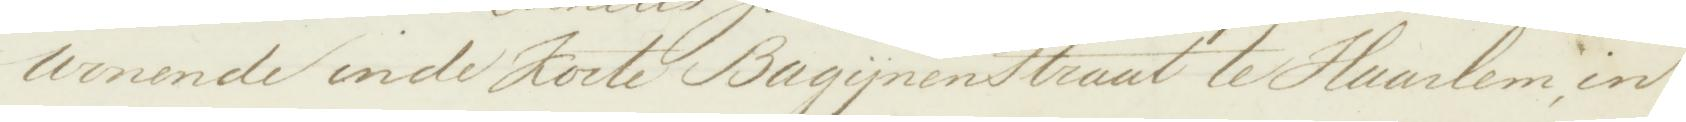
wonende in de Korte Bagijnenstraat te Haarlem, in
